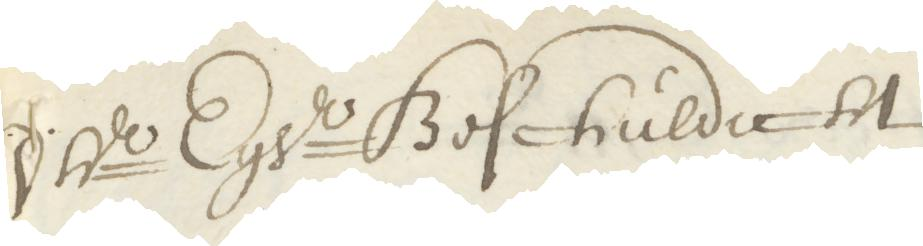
d h=r Eys=r Beschuldicht
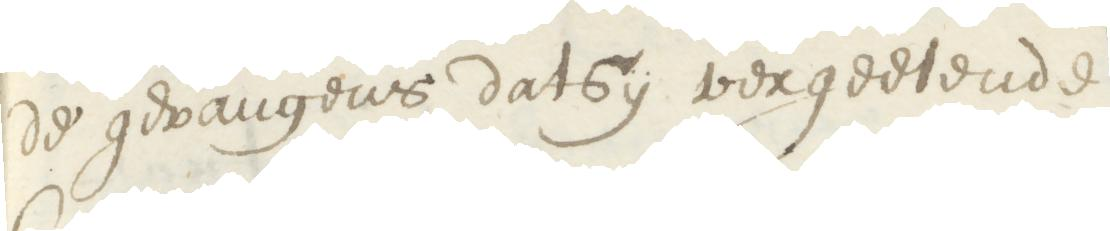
de gevangens dat sij vergeetende
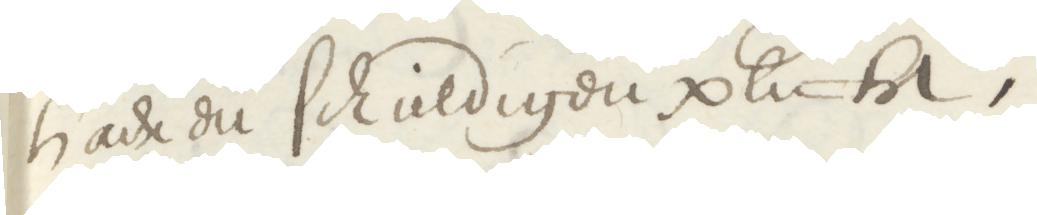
haer en schuldigen plicht,
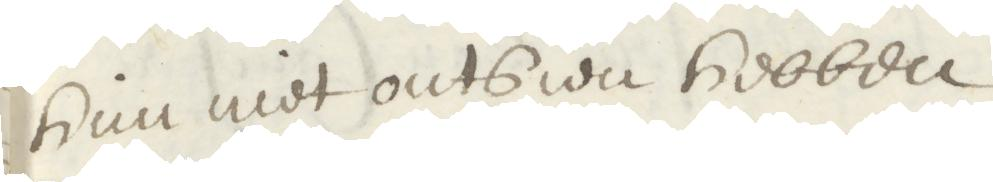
hun niet ontsien hebben
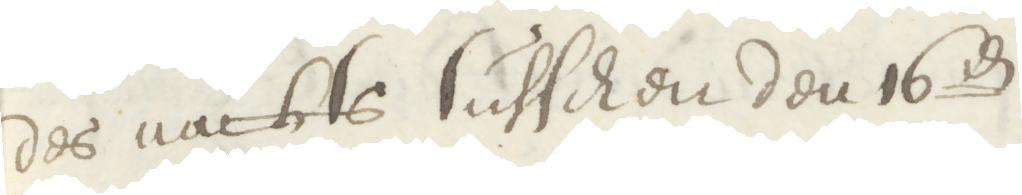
des nachts tusschen den 16=en
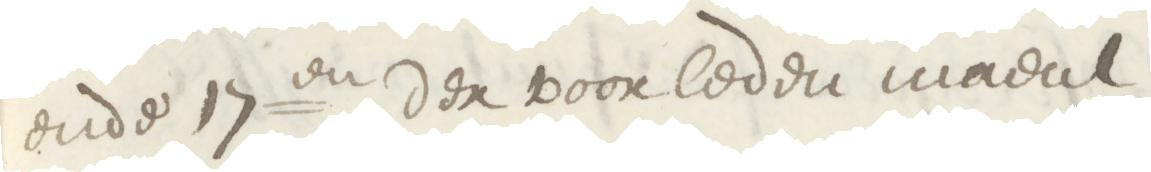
ende 17=en der voorleden maent
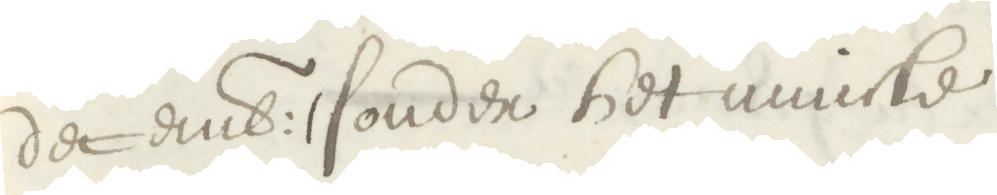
decemb: (sonder het minste
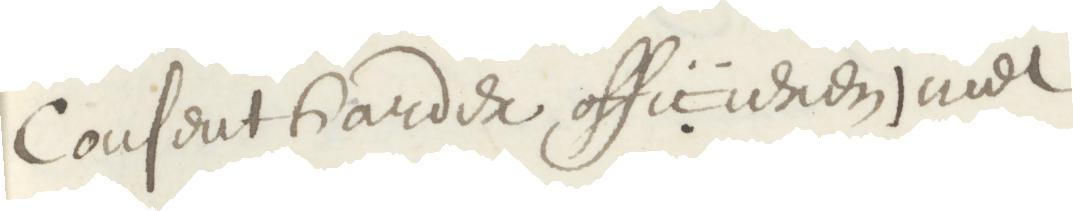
Consent harder officieren) niet
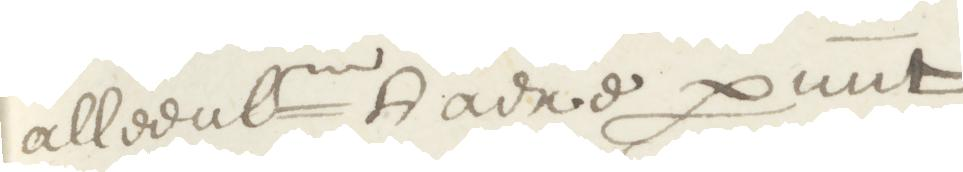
alleenlijk haere punt
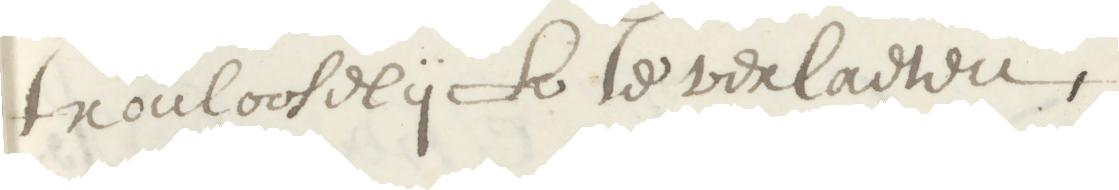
troulooselijck te verlaeten,
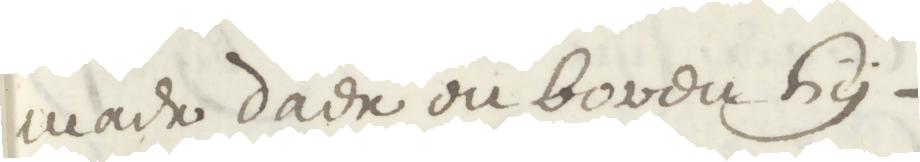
maer daer en boven hij
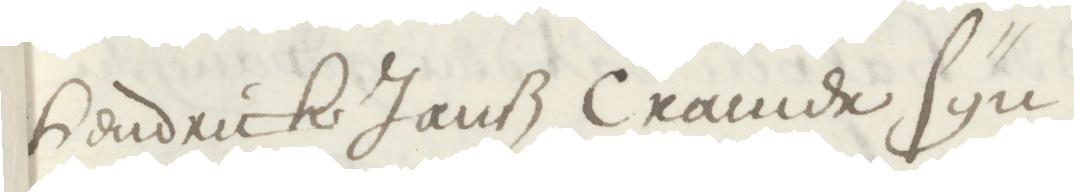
hendrick Janss Cramer sijn
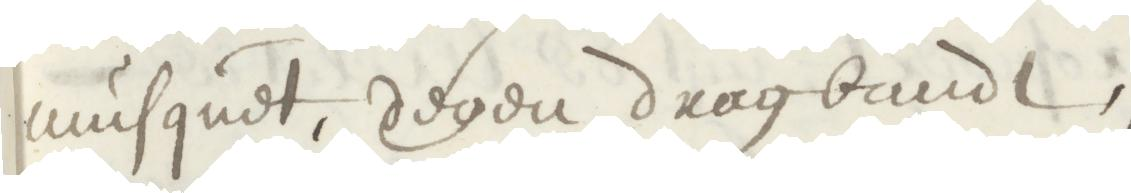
musquet, degen, dragbandt,
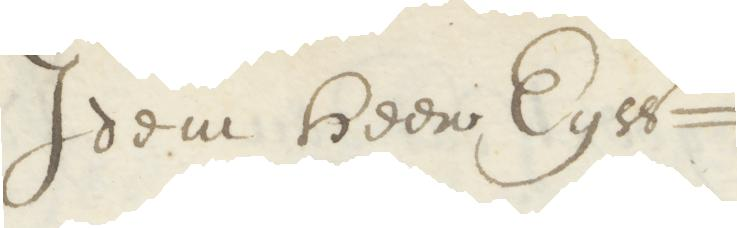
Idem Heer Eyss=r
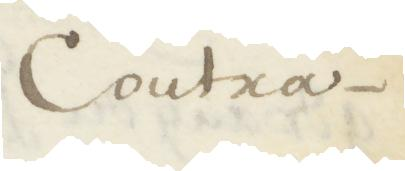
Contra-
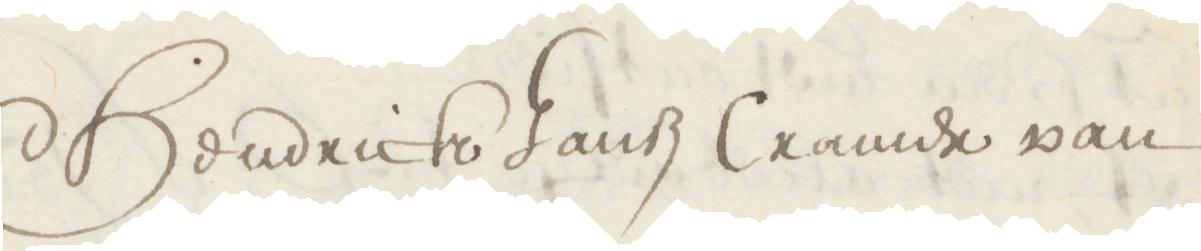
Hendrick Janss Cramer van
